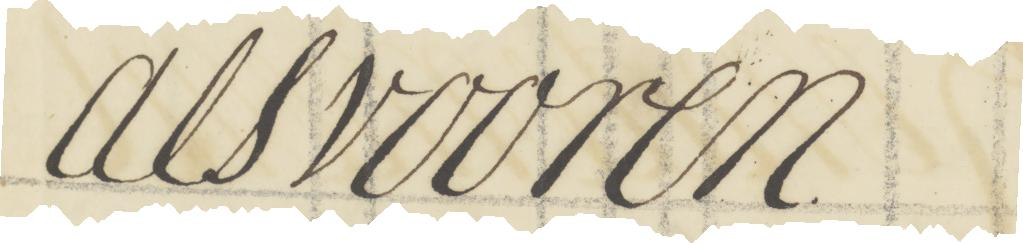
als vooren.
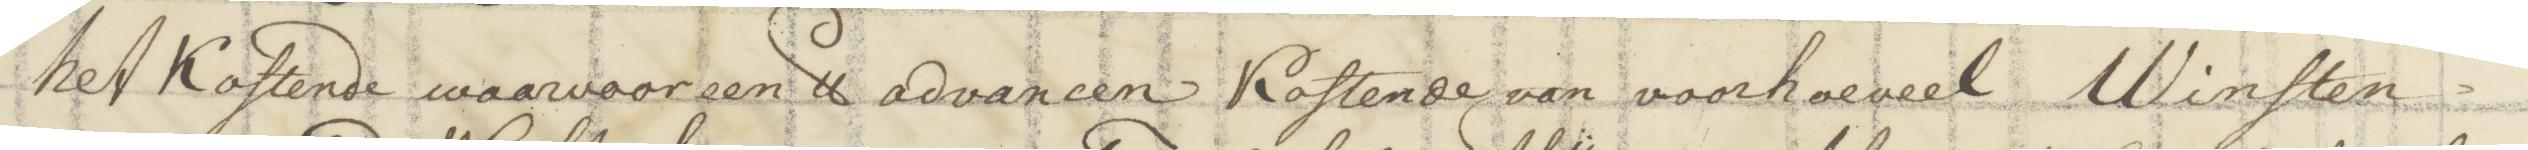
het Kostende waarvoor een lb advancen Kostende van voor hoeveel Winsten
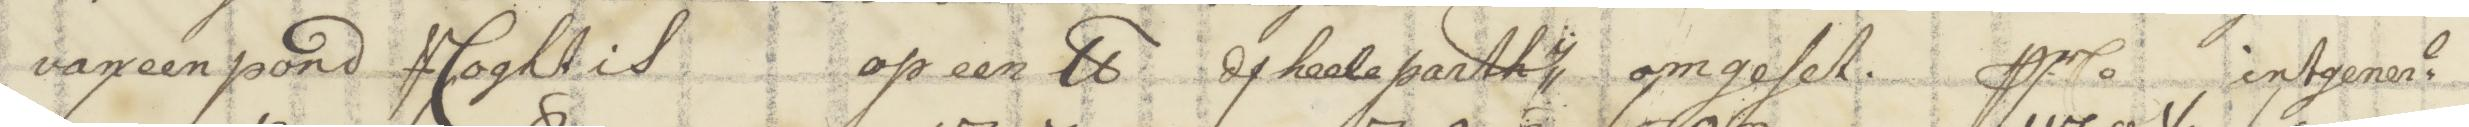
van een pond vercoghtis op een lb de heele parth„ij omgeset. p.rCo intgener„l
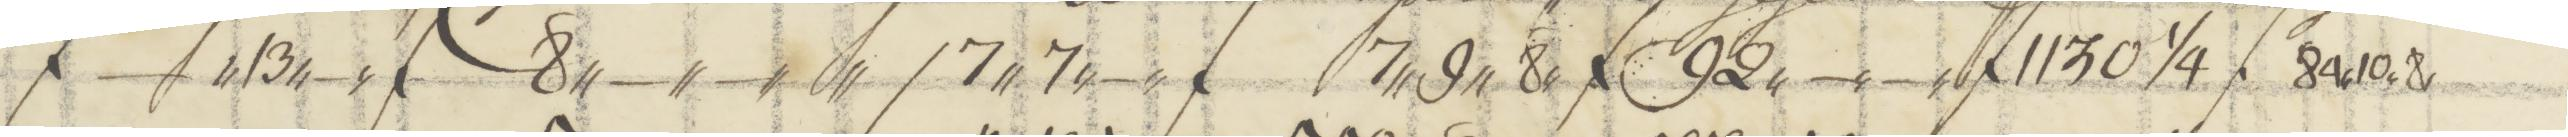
ƒ —„ 13„ —„ ƒ 8„ —„ —„ „ ƒ 7„ 7„ —„ ƒ 7„ 9„ 8„ ƒ 92„ —„ —„ ƒ 1130 1/4 ƒ 84„ 10„ 8
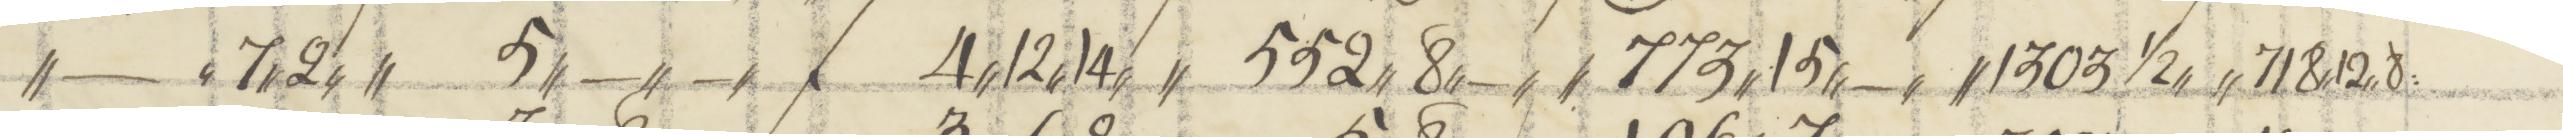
„ —„ 7„ 2„ „ 5„ —„ —„ ƒ 4„ 12„ 14„ „ 552„ 8„ —„ „ 773„ 15„ —„ „ 1303 1/2„ „ 718„ 12„ 8:
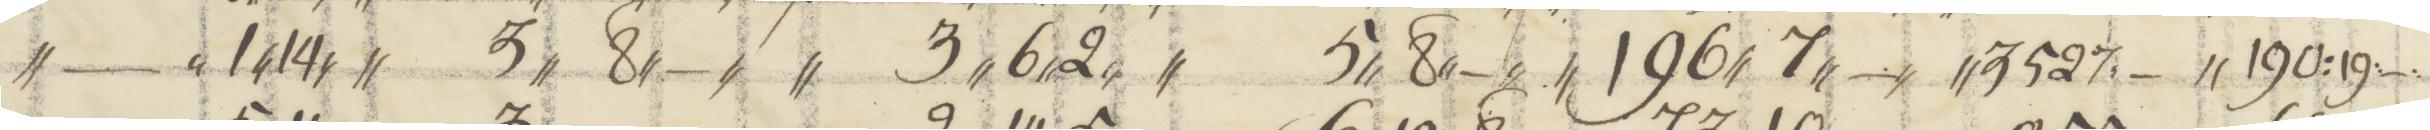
„ —„ 1„ 14„ „ 3„ 8„ —„ „ 3„ 6„ 2„ „ 5„ 8„ —„ „ 196„ 7„ —„ „ 3527 — „ 190: 19: —:
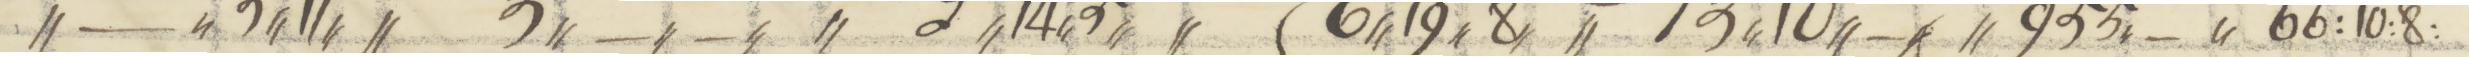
„ —„ 5„ 11„ „ 3„ —„ —„ „ 2„ 14„ 5„ „ 6„ 19„ 8„ „ 73„ 10„ —„ „ 955„ — „ 66: 10: 8:
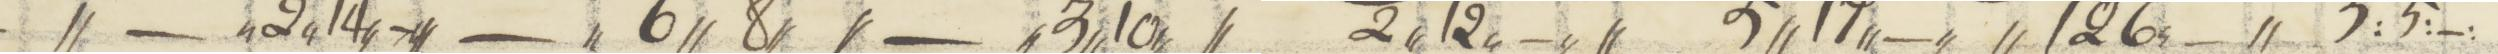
„ —„ 2„ 14„ — „ —„ 6„ 8„ „ —„ 3„ 10„ „ 2„ 12„ —„ „ 5„ 17„ —„ „ 126„ — „ 3: 5: —:
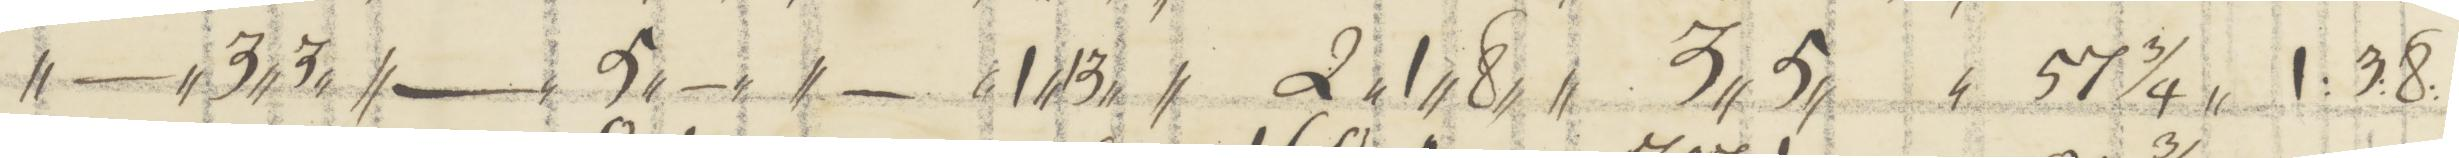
„ —„ 3„ 3„ „ —„ 5„ —„ „ —„ 1„ 13„ „ 2„ 1„ 8„ „ 3„ 5„ „ 57 3/4 „ 1: 3: 8:
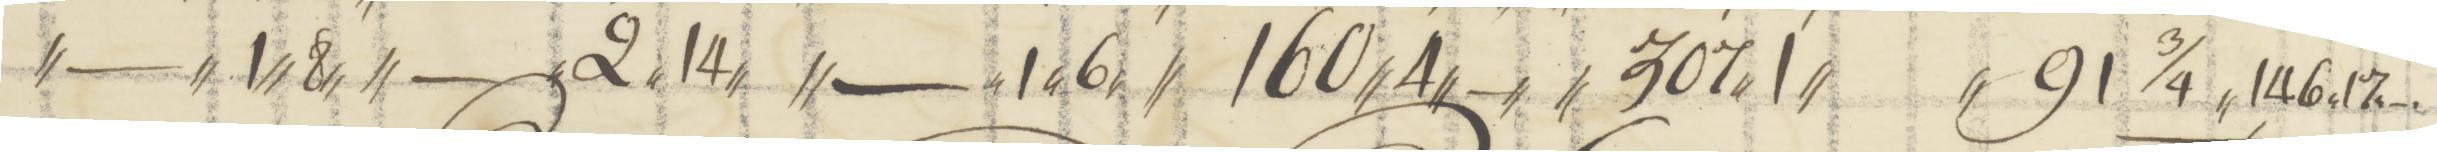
„ —„ 1„ 8„ „ —„ 2„ 14„ „ —„ 1„ 6„ „ 160„ 4„ —„ „ 307„ 1„ „ 91 3/4 „ 146„ 17„ —„
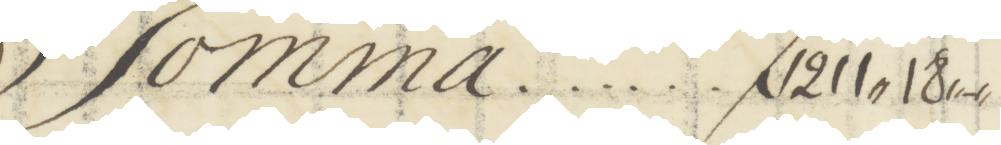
Somma . . . . . . ƒ 1211„ 18„ —„
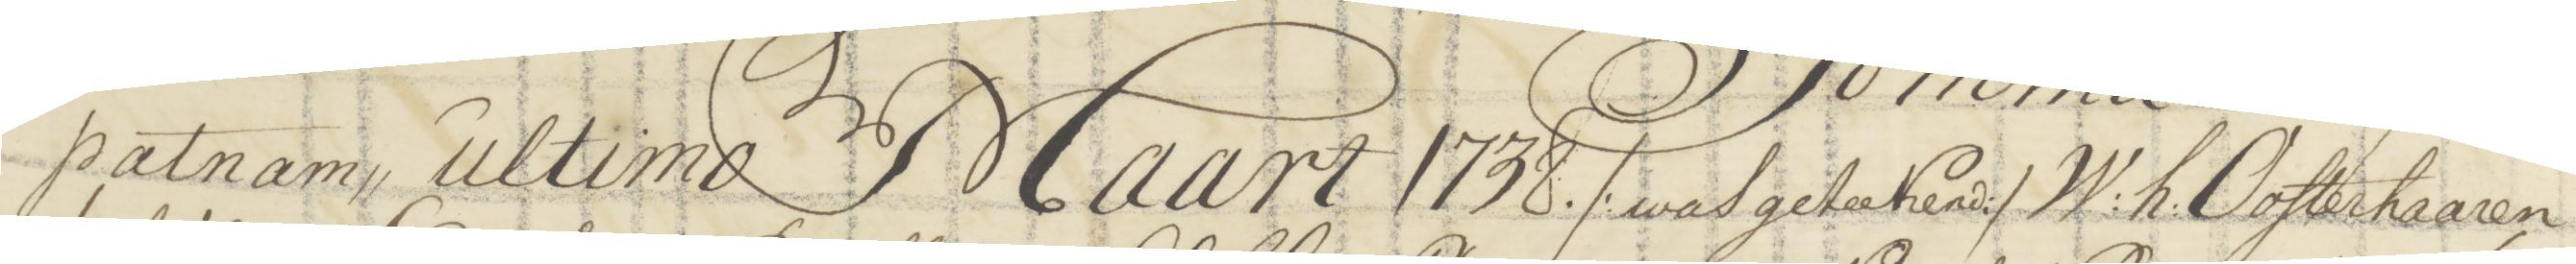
patnam „ ultimo Maart 1738. /:was geteekend:/ W: h: Oosterhaaren
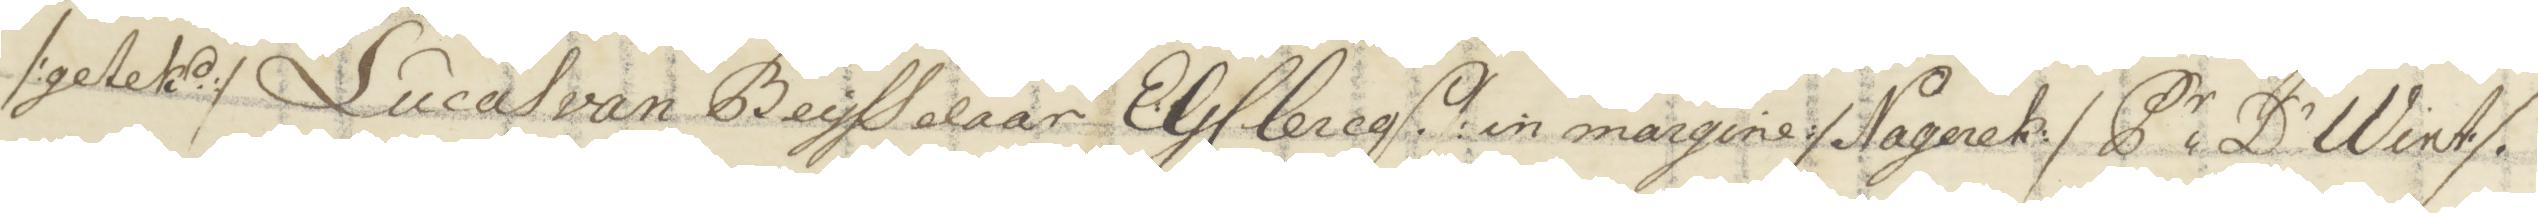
/:getek.d:/ Lucas van Beijsselaar EGClercq. /:in margine:/ Nagerek: /P„r D' Wint/.
